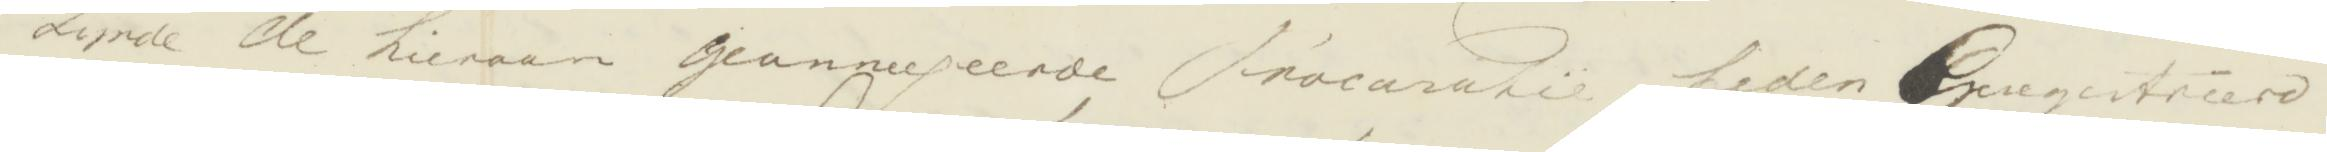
zynde de hieraan geannexeerde Procuratie heden Geregistreerd
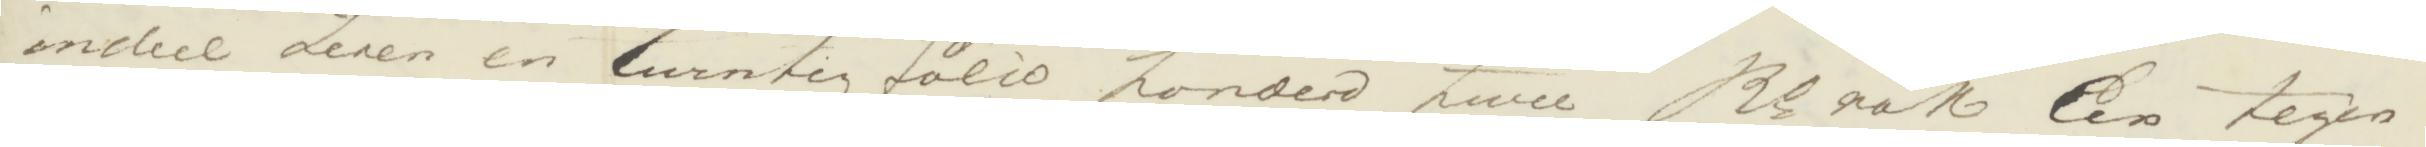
in deel zeven en twintig folio honderd twee R=o vak Een tegen
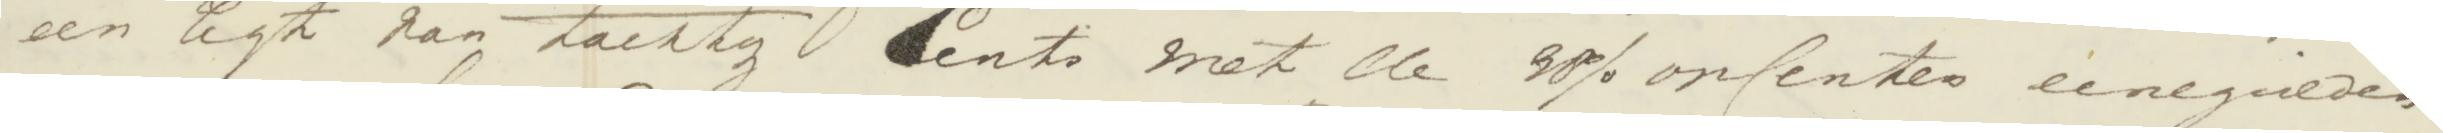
een regt van tachtig Cents met de 38% opCenten eenegulden
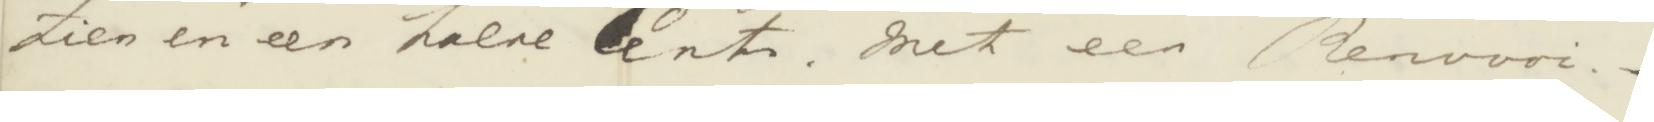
tien en een halve Cents. met een Renvooi.-
